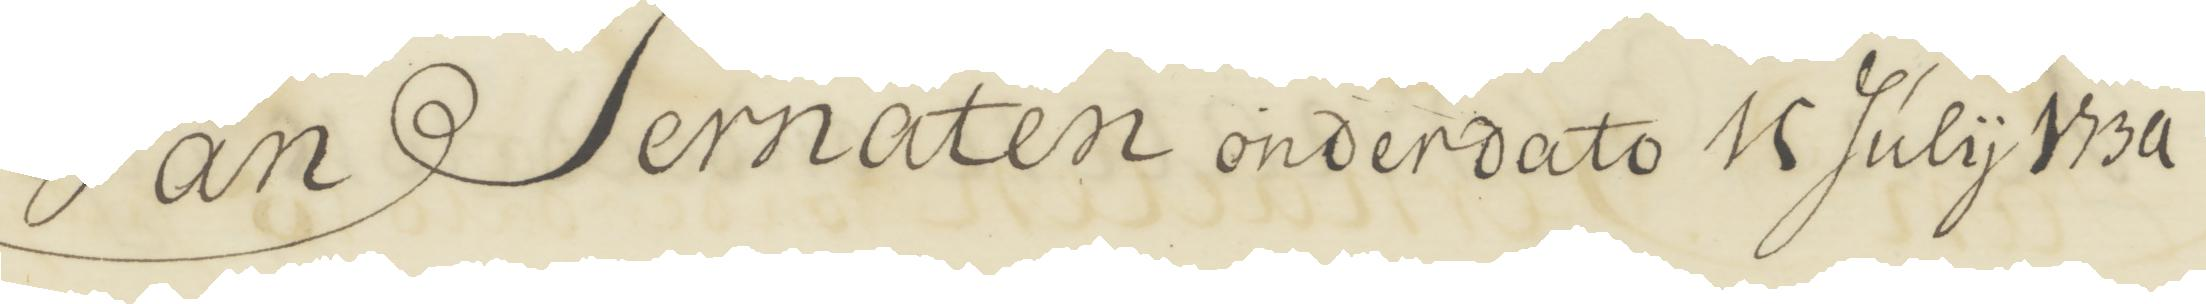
Van Ternaten onder dato 15 Julij 1734
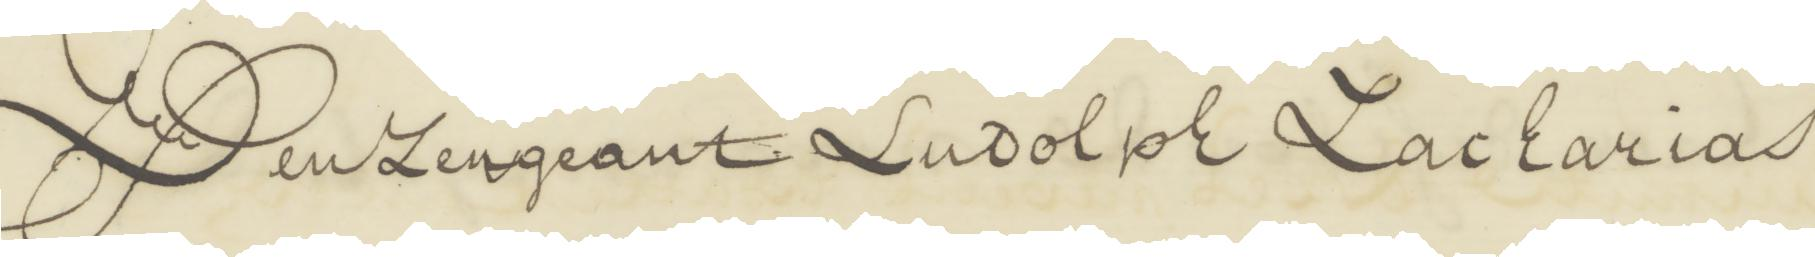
Den zergeant Ludolph Zacharias
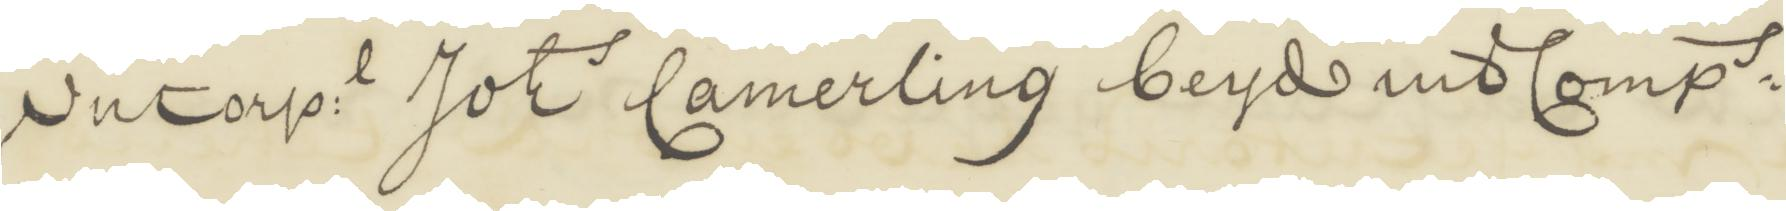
en corp:l Johs Camerling beyde in dComp:s
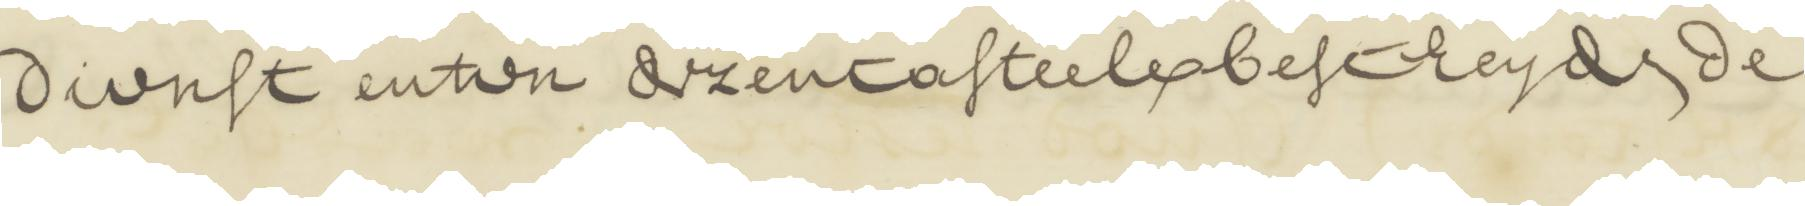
dienst enten dezen casteele bescheyden de
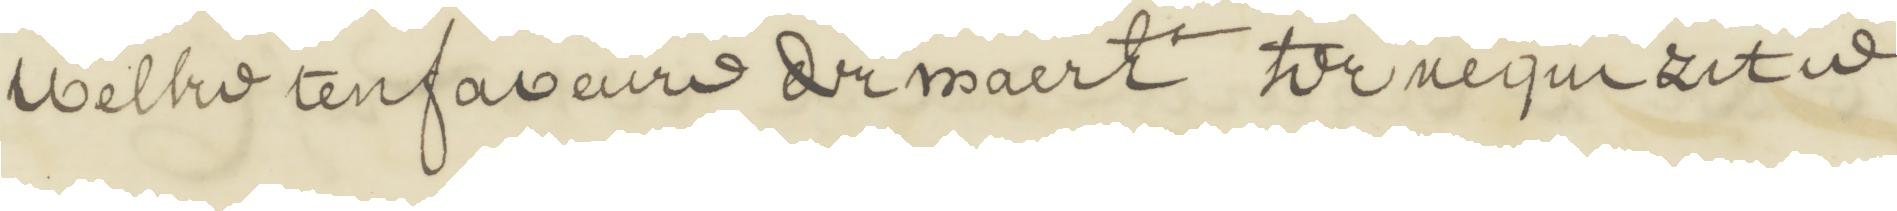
welke ten faveure der waerht ter requizitie
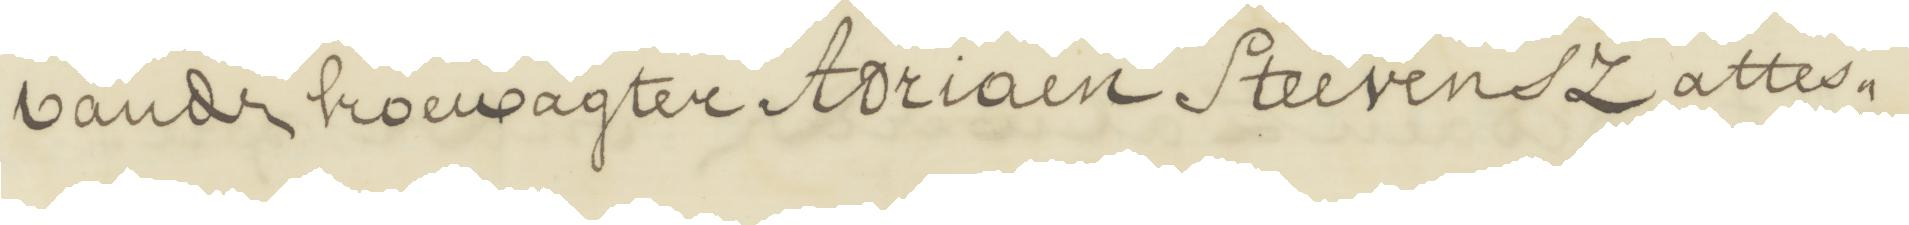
van den koewagter Adriaen Steevenz attes„
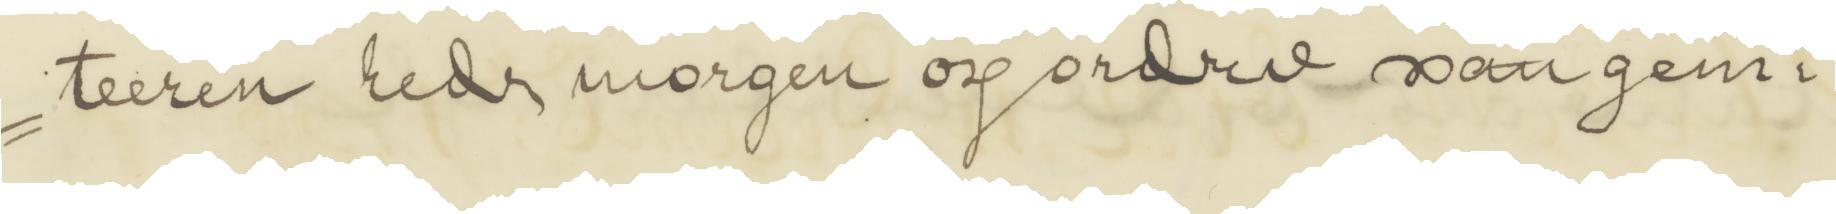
„teeren heden morgen op ordere van gem:
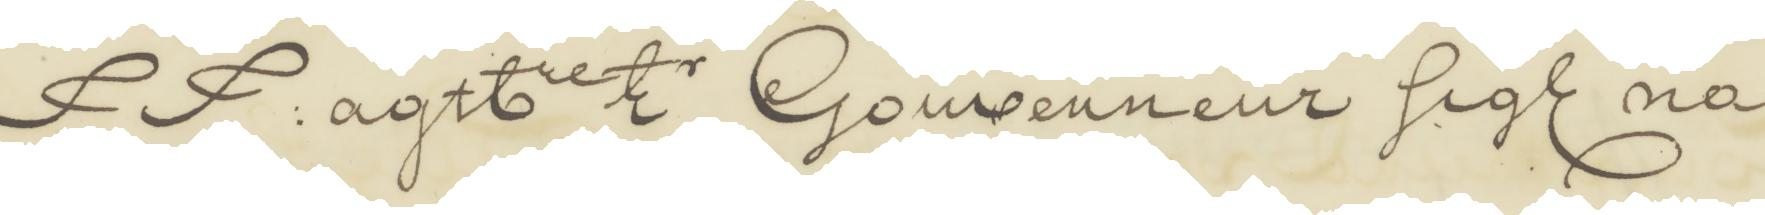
E E: agtbre hr Gouverneur sigh na
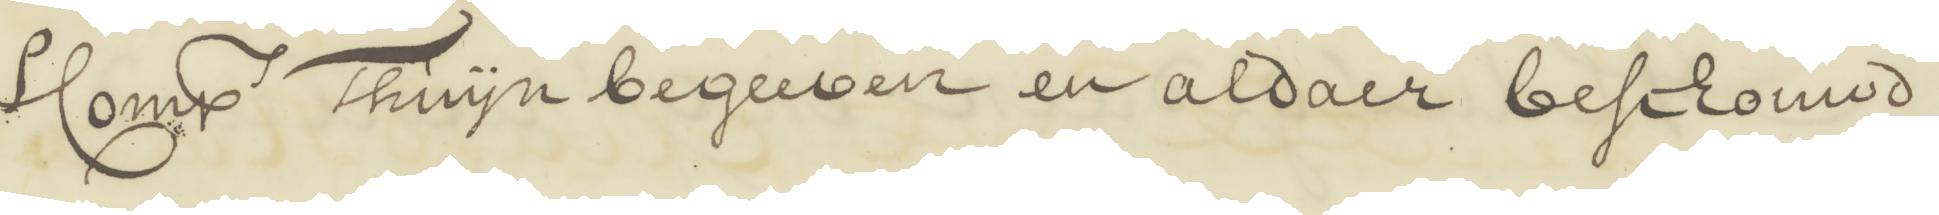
sComps Thuijn begeeven en aldaer beschouwd
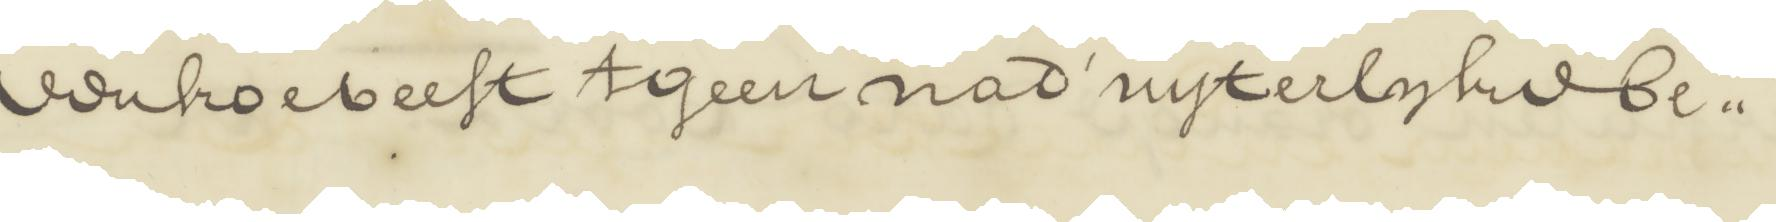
een koeveest t geen na d' uyterlyke be„
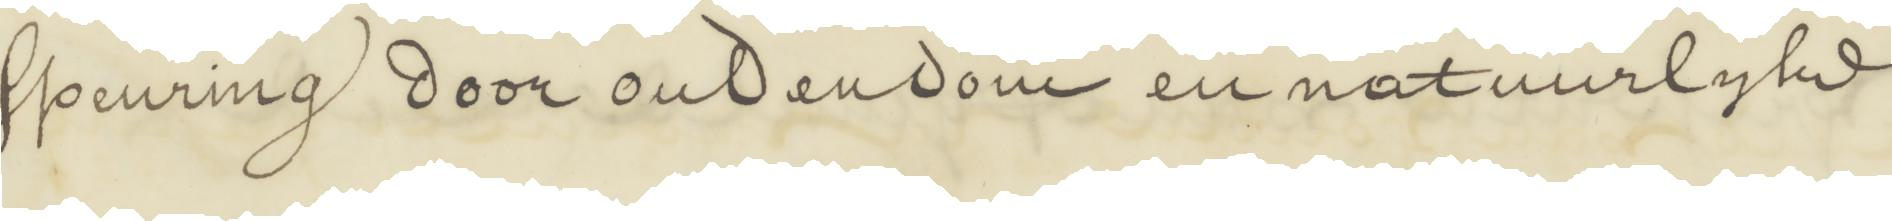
speuring door onderdom en natuurlyke
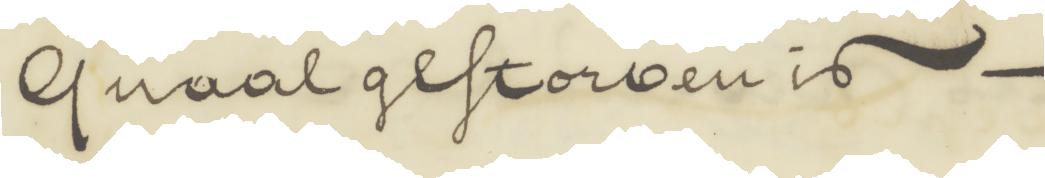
Quaal gestorven is —
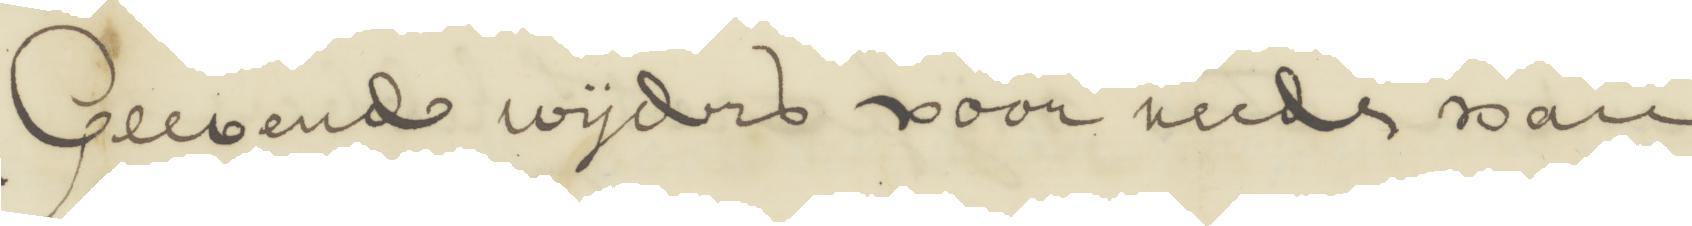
Geevende wijders voor reeden van
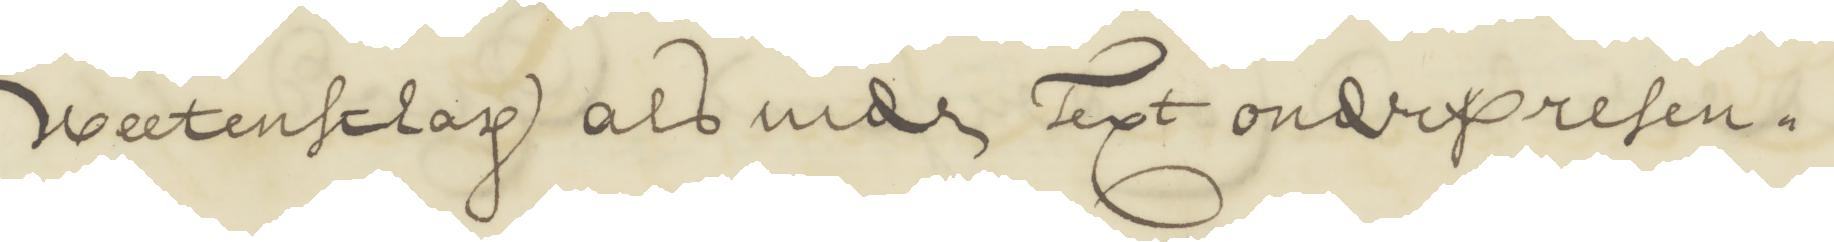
weetenschap als inden Text onderpresen„
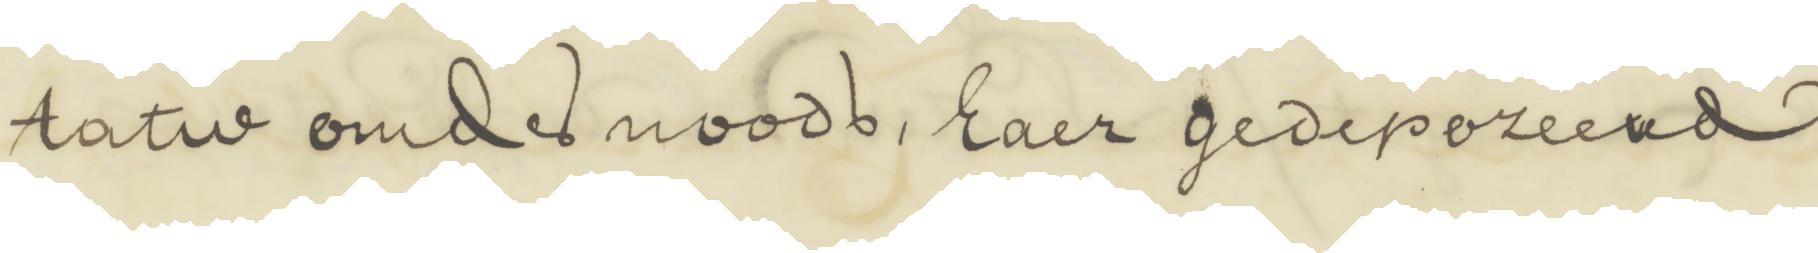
tatie om des noods, haer gedepozeerd
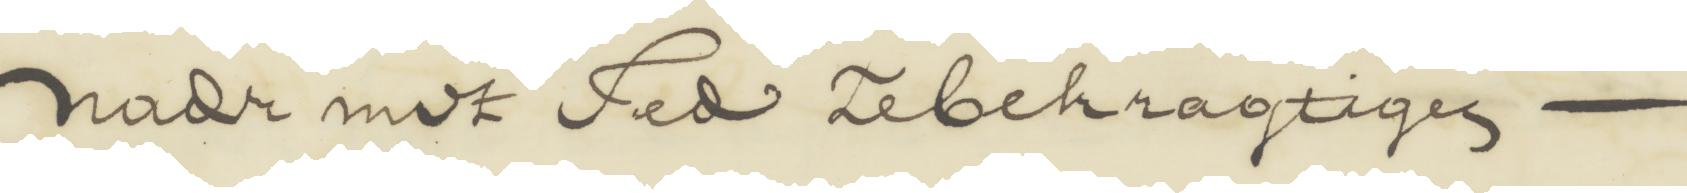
nader met Eede te bekragtigen —
